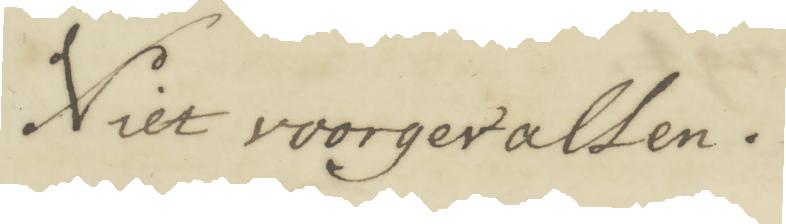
Niet voorgevallen.
